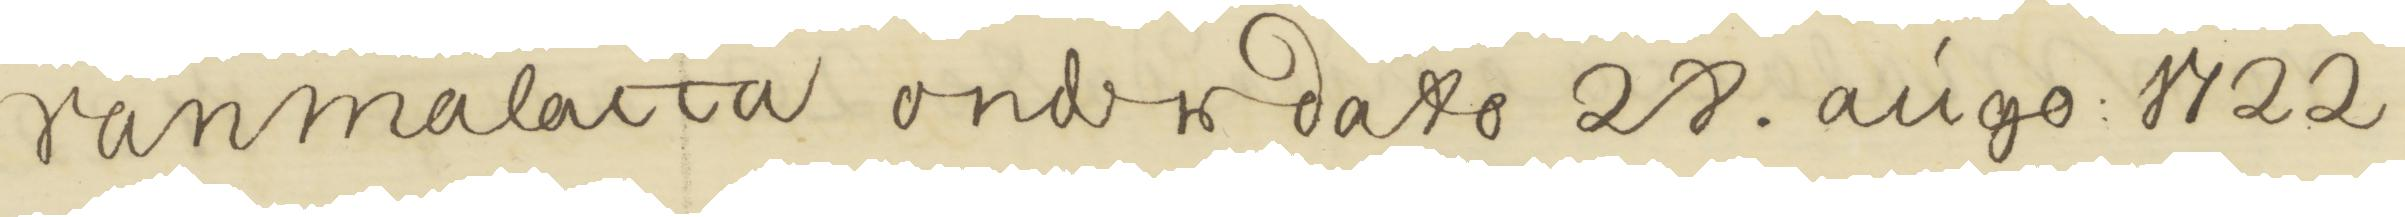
van malacca onder dato 28. augo: 1722
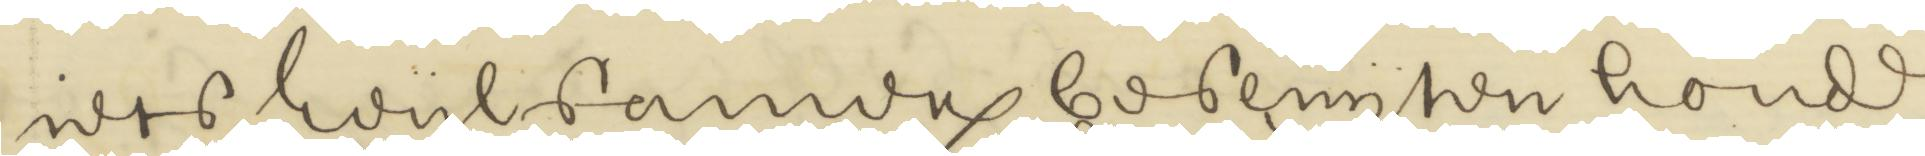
iets heijlsamer besluijten konde
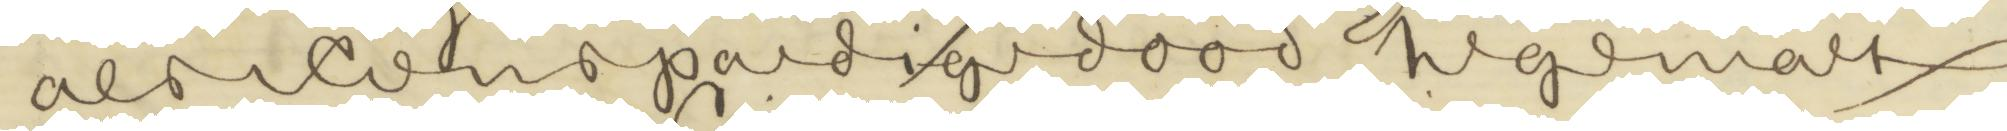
als Een spoedige dood te gemoet
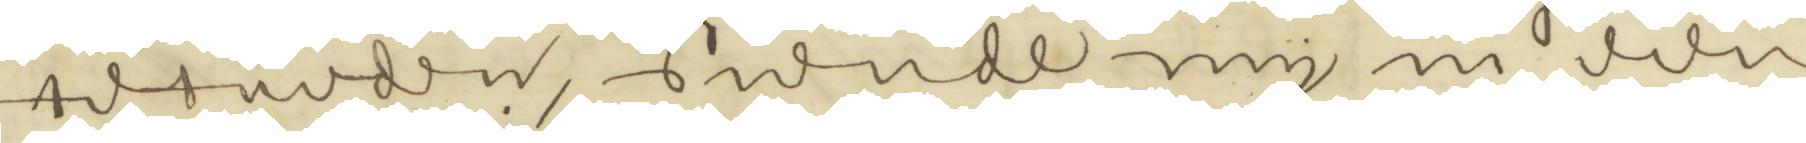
te treden, siende mij in een
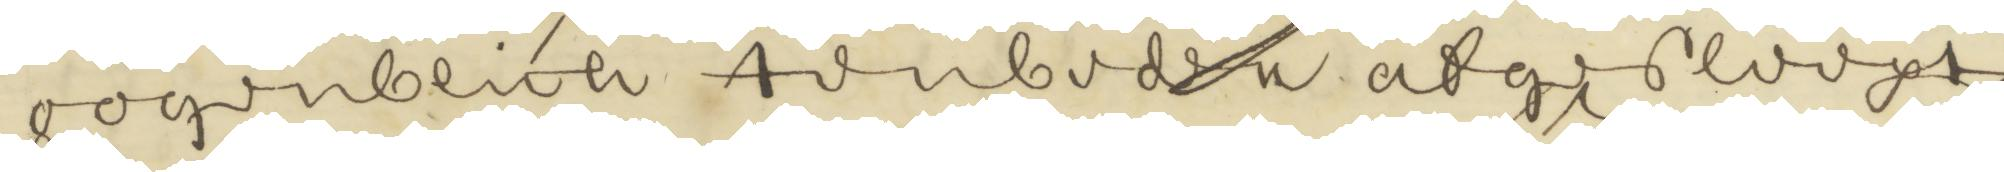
oogenblick ten beder afgesleept
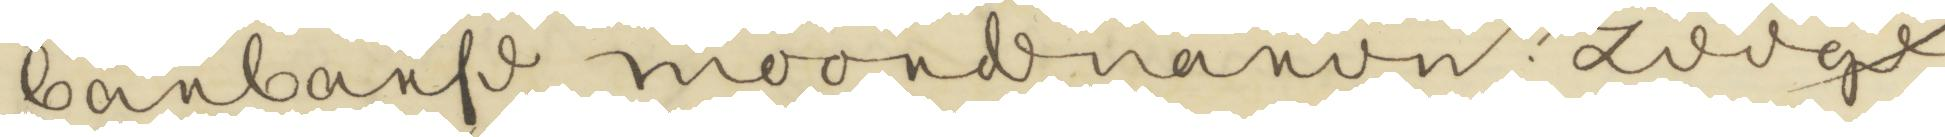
barbarse moordenaren. Zeege
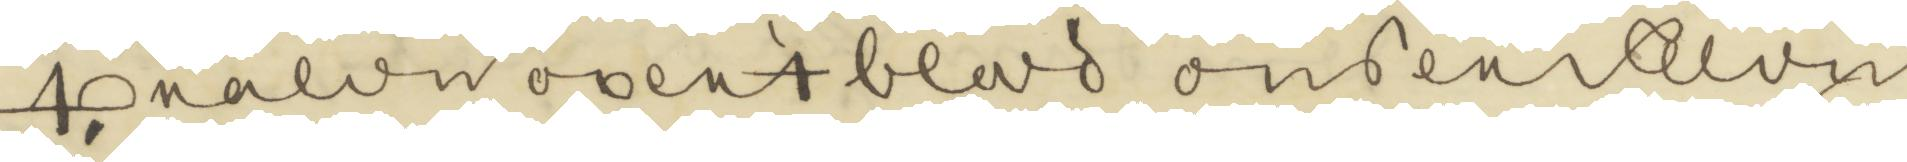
pralen over't bloed onser Ellen
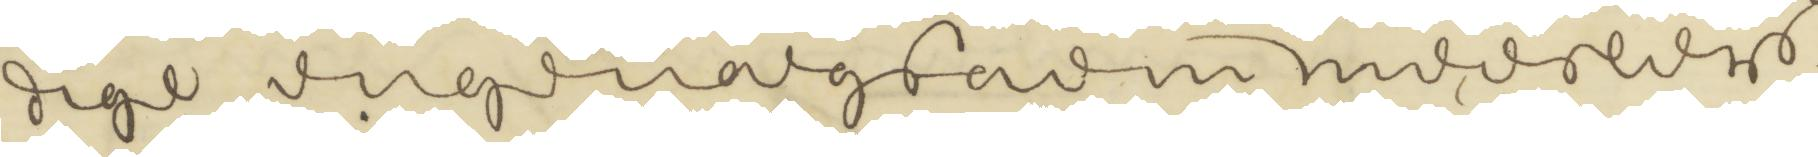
dige engenoegsaem meester
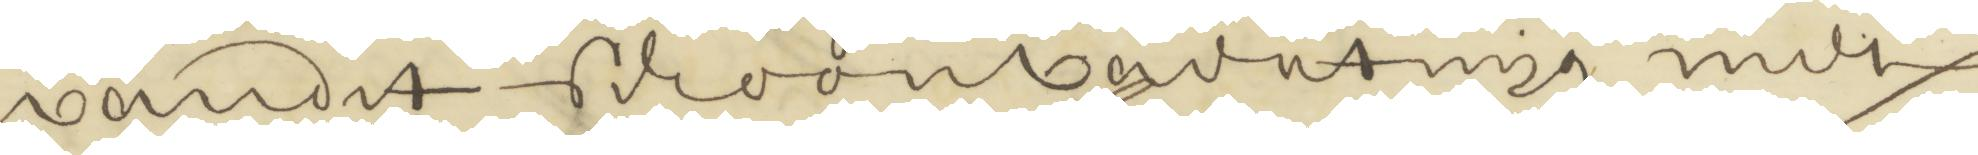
vandit schoon vaertuijg met
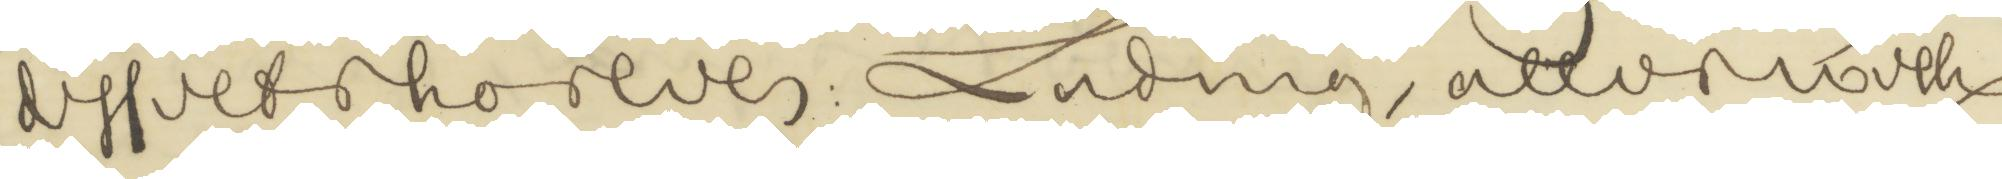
desselfs kostelijke Lading, alles welk
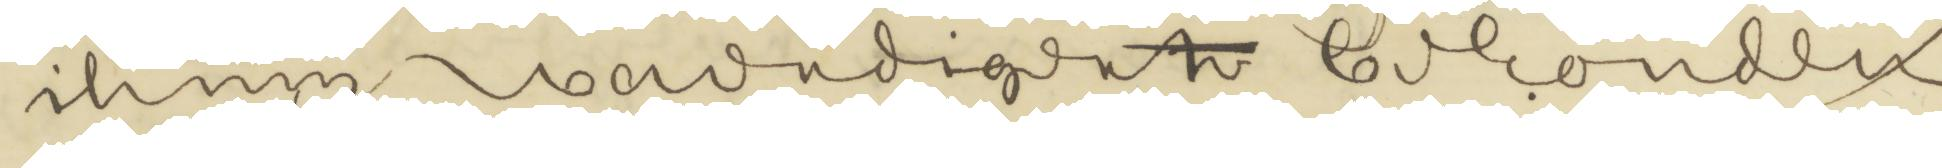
ik mij waerdiger te behouden
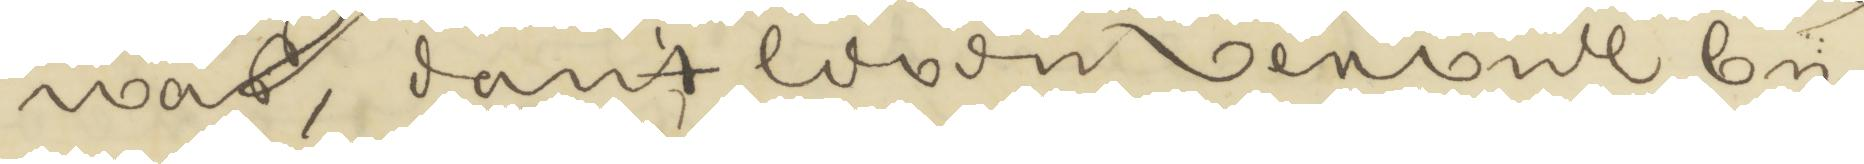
was, dan’t leven verviel bij
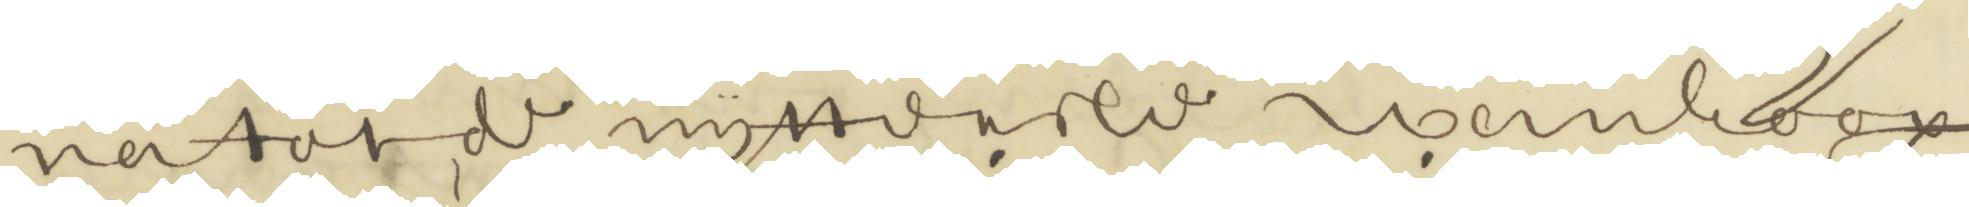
na tot de uijtterste wanhoop
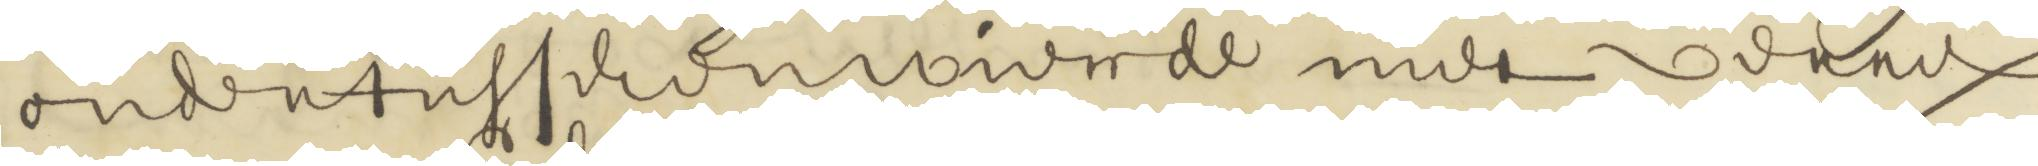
onder tussenen wierde niet verre
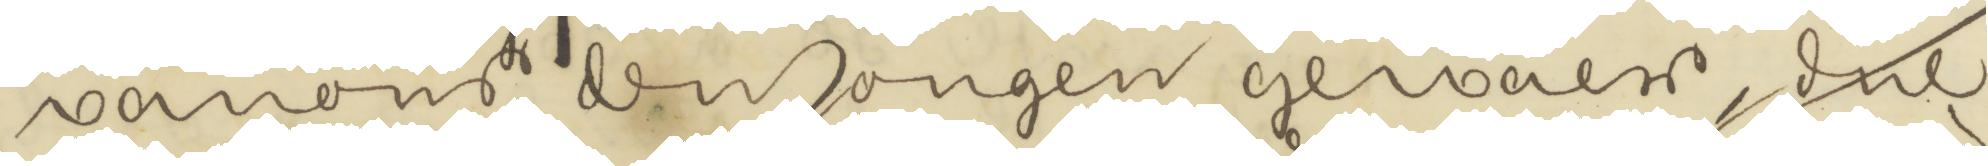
vanons den Jongen gewaer, die
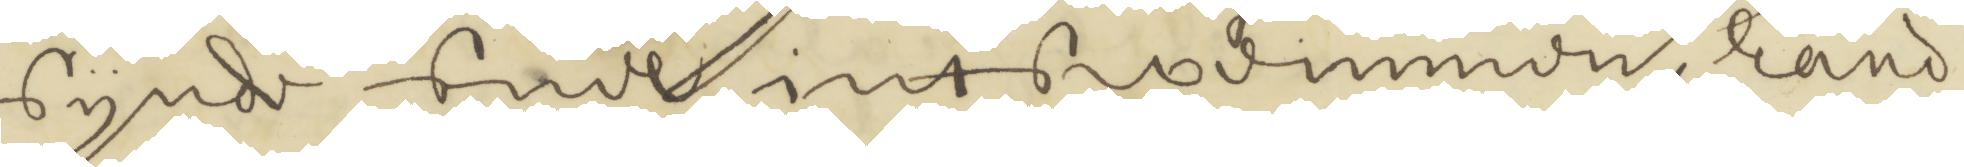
sijnde snel intswemmen, hard
